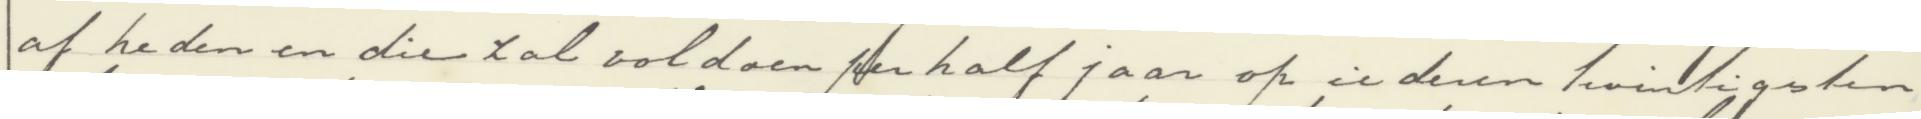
af heden en die zal voldoen ten half jaar op iederen twintigsten
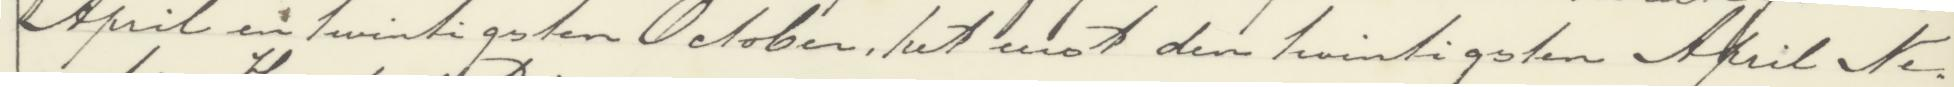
April en twintigsten October, het eerst den twintigsten April Ne
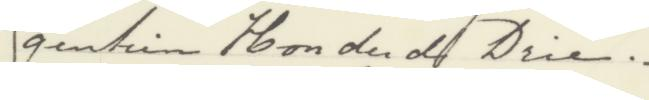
gentien Honderd Drie.
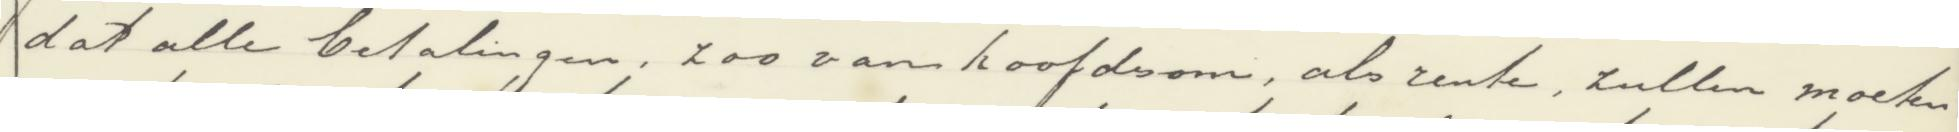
dat alle betalingen, zoo van hoofdoom, als rente, zullen moeten
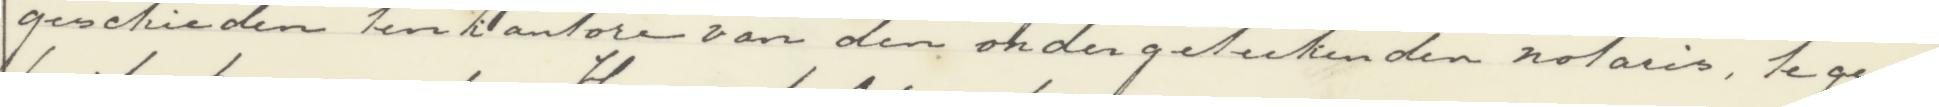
geschieden ten kantore van den ondergeteekenden notaris, tegen
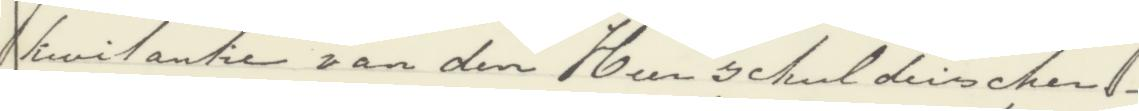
kwitantie van den Heer schuldeischer.
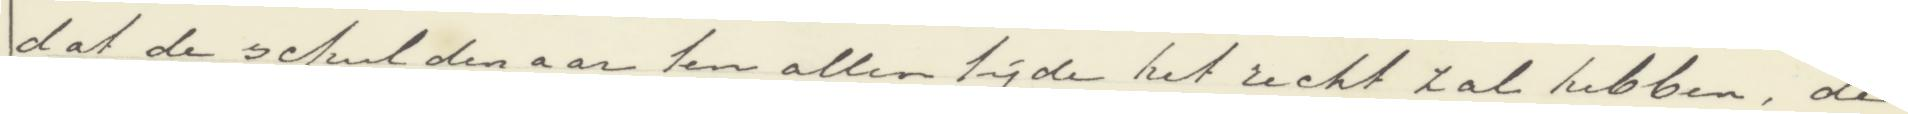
dat de schuldenaar ten allen tijde het recht zal hebben, de
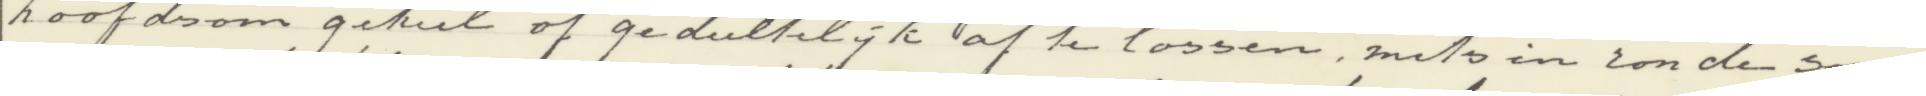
hoofdsom geheel of gedeeltelijk af te lossen, mits in ronden som
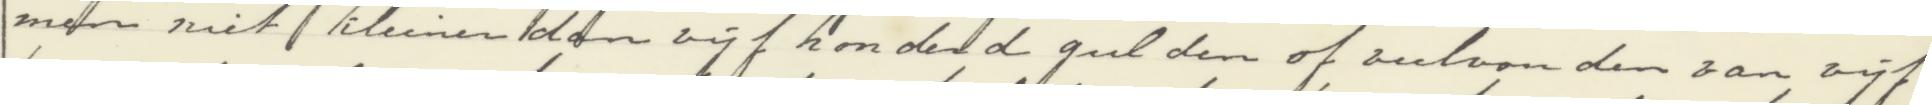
men niet kleiner dan vijf honderd gulden of veelvouden van vijf
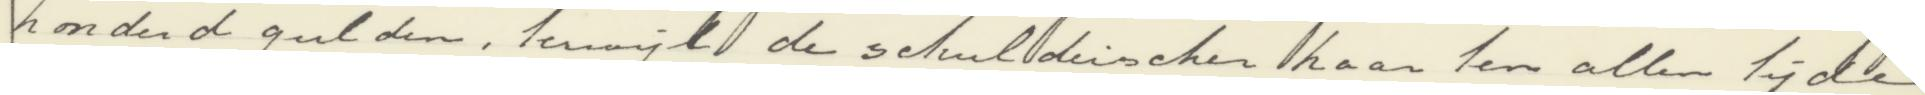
honderd gulden, tewijl de schuldeischer haar ten allen bij tijde
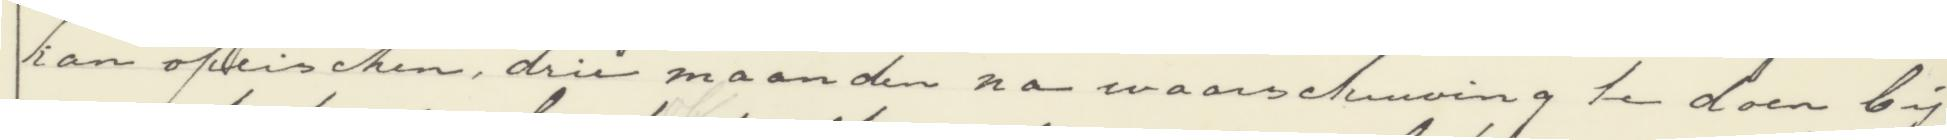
kan opeischen, drie maanden na waarschuwing te doen bij
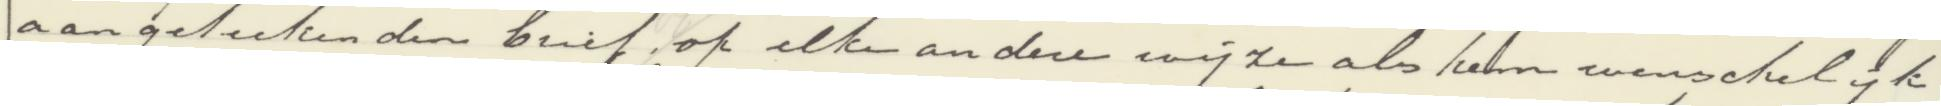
aangeteekenden brief, op elke andere wijze als hem wenschelijk
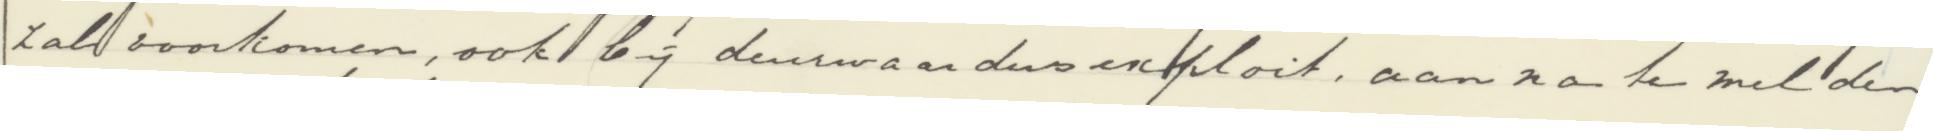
zal doorkomen, ook bij deurwaarders exploit, aan na te melden
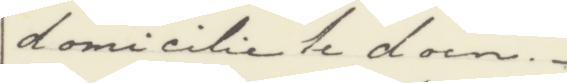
domicilie te doen.
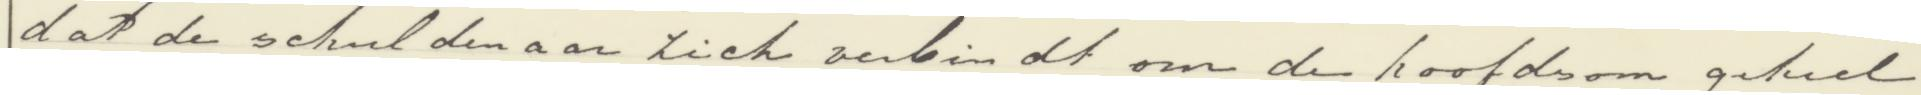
dat de schuldenaar zich verbindt om den hoofdsom geheel
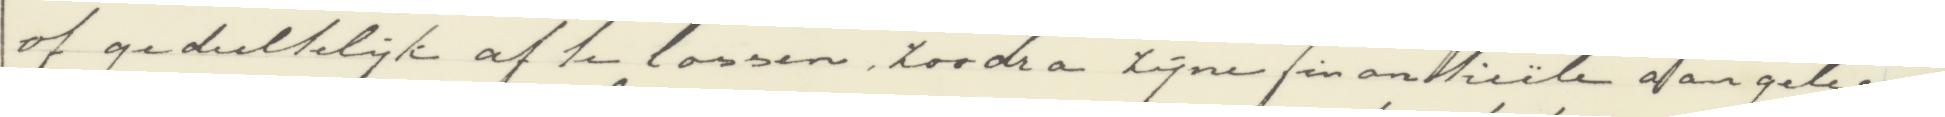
of gedeeltelijk af te lossen, zoodra zijne fincanieële aangelegen
